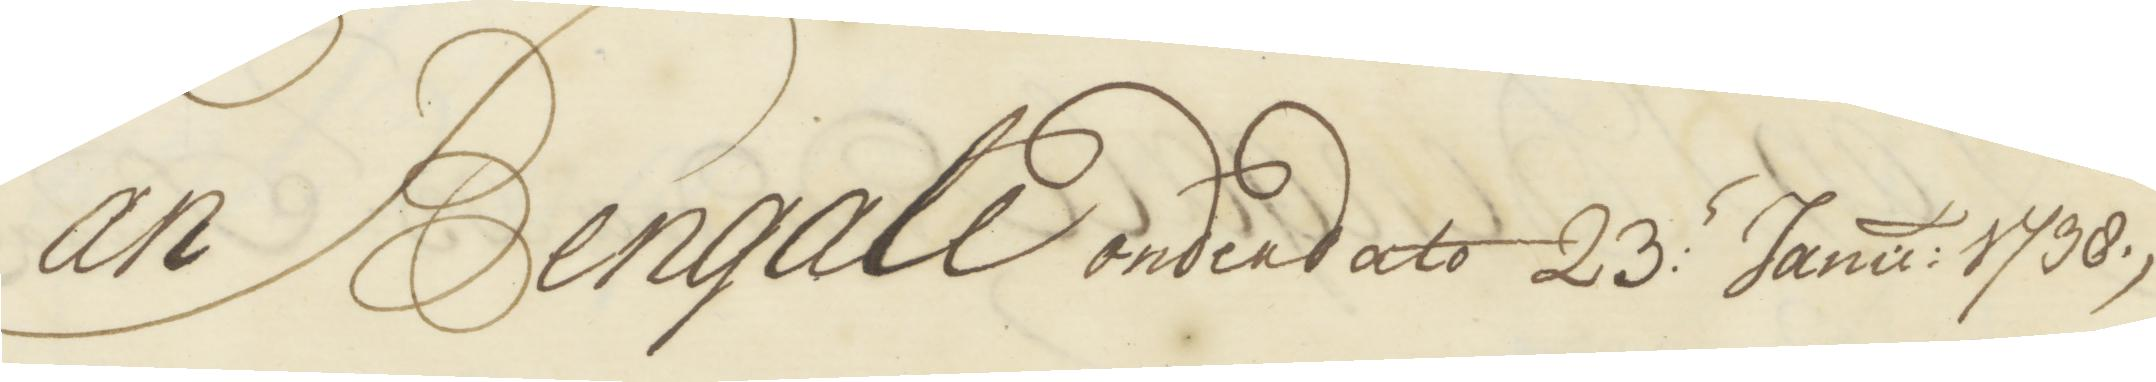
Van Bengale onder dato 23:' Janu: 1738:,
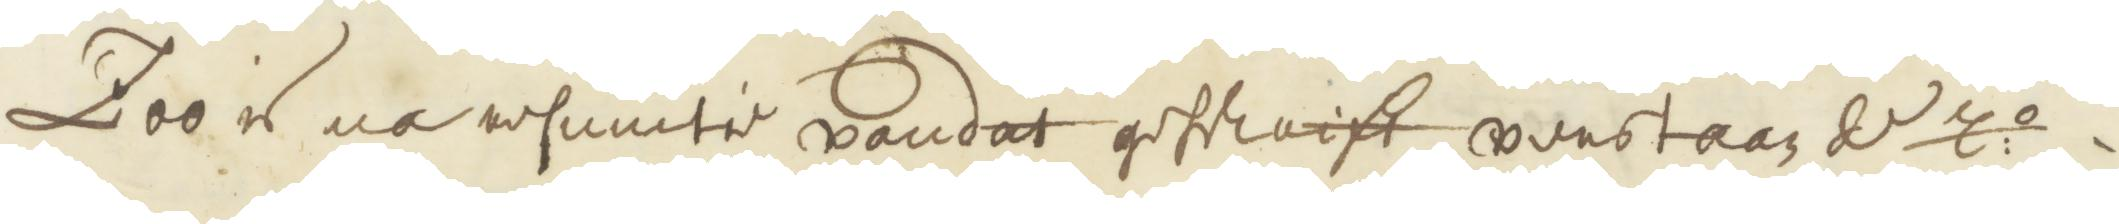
Zoo is na resumtie van dat geschrift verstaan de r:/o
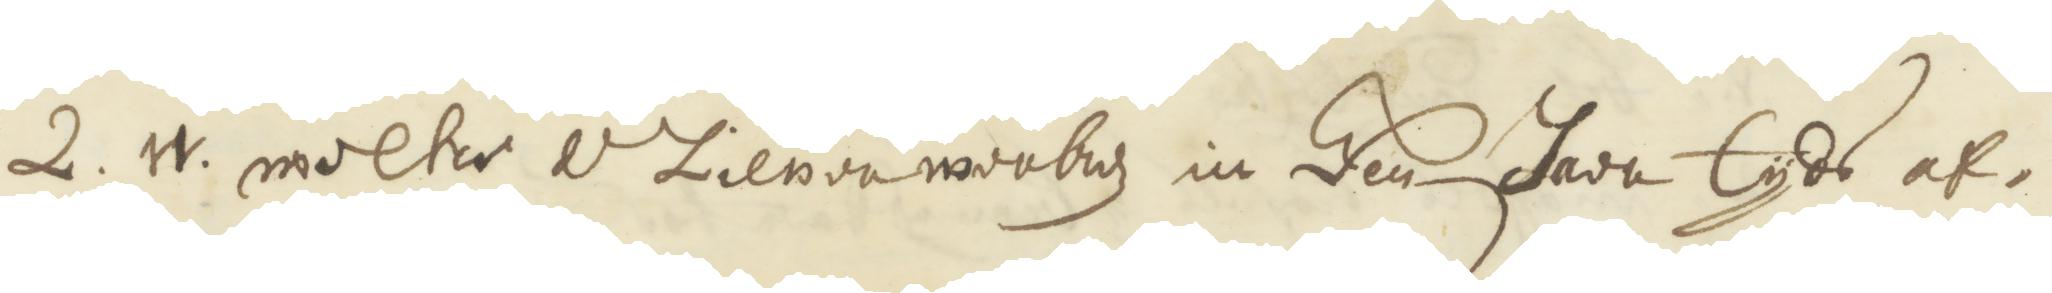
2. 11. welke de zilverwerken in Een Iaer tijds af„
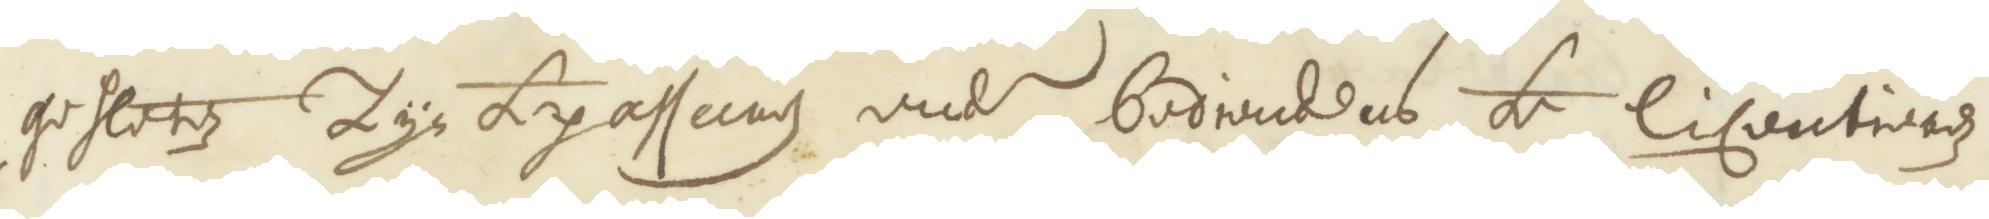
gesloten zijn te passeeren ende bediendens te licentieren
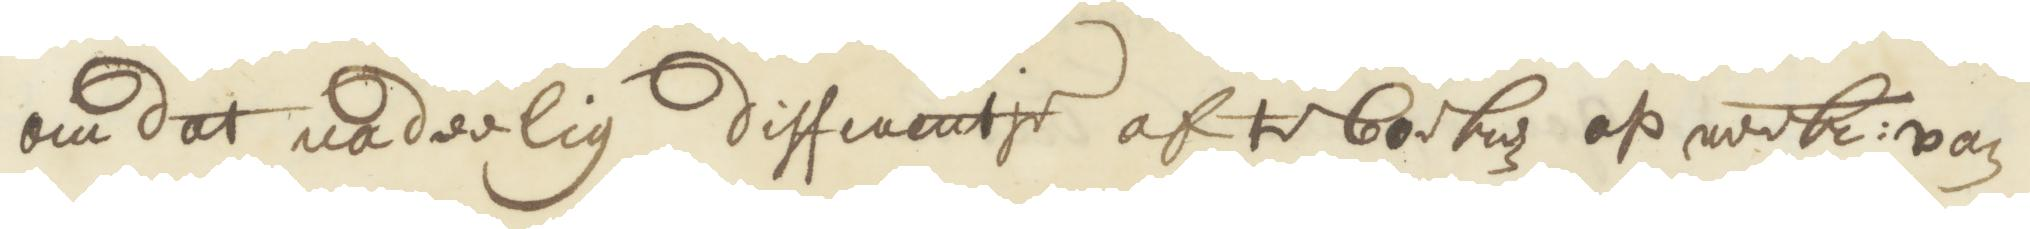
om dat nadeelig differentje af te boeken op reek: van
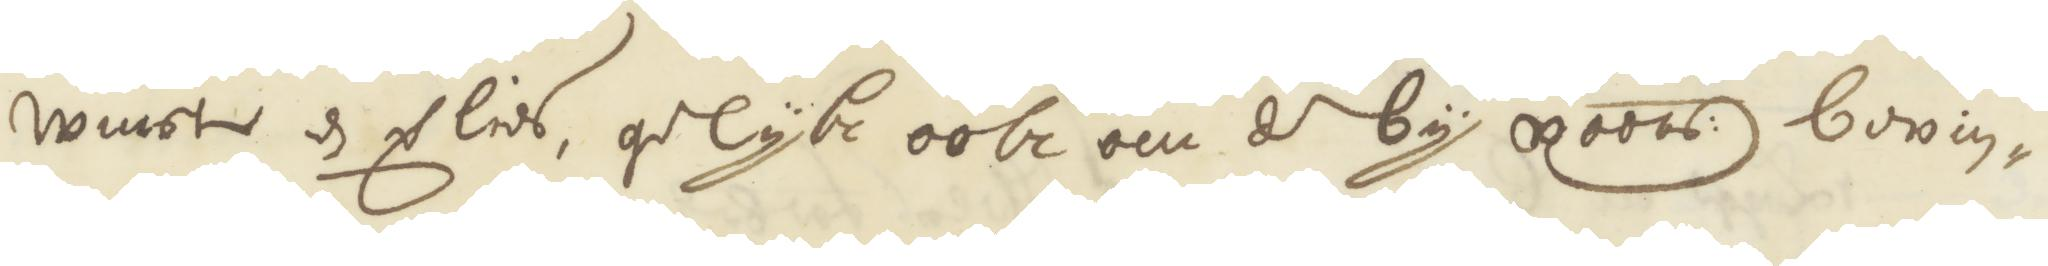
winst en verlies, gelijk ook om de bij voors bevin„
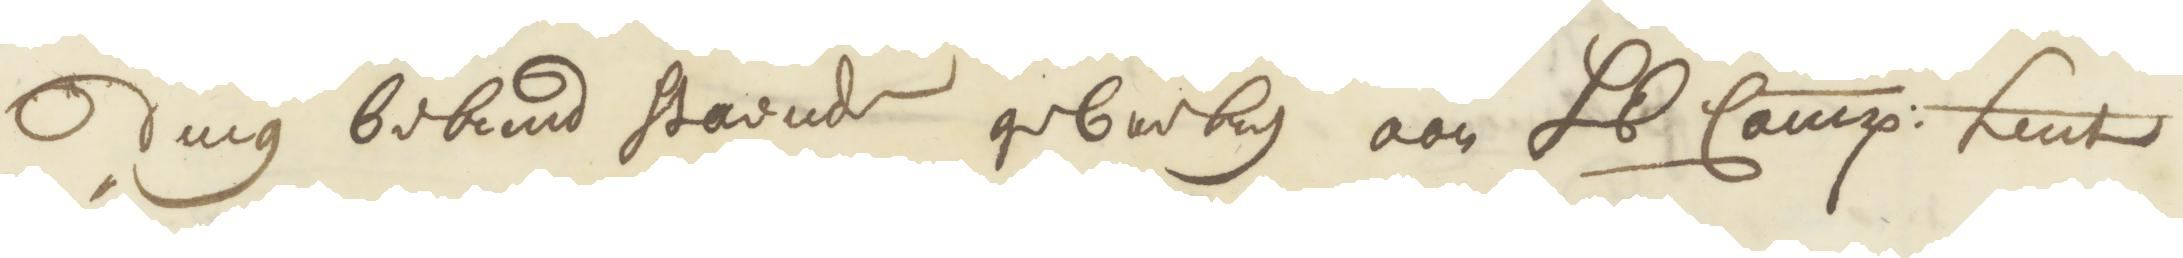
ding bekend staende gebreken aan SE Comp: tent
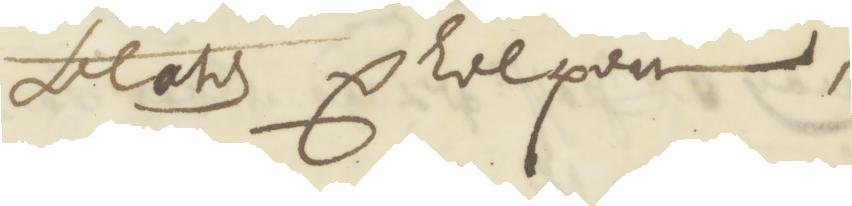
telaten verhelpen,
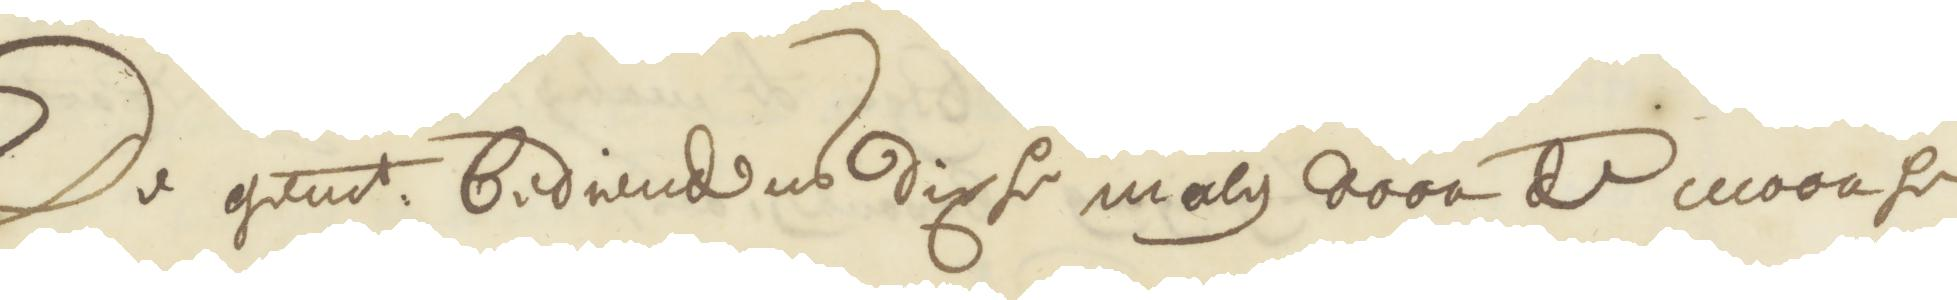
De gem:t bediendens diverse malen door de moorse
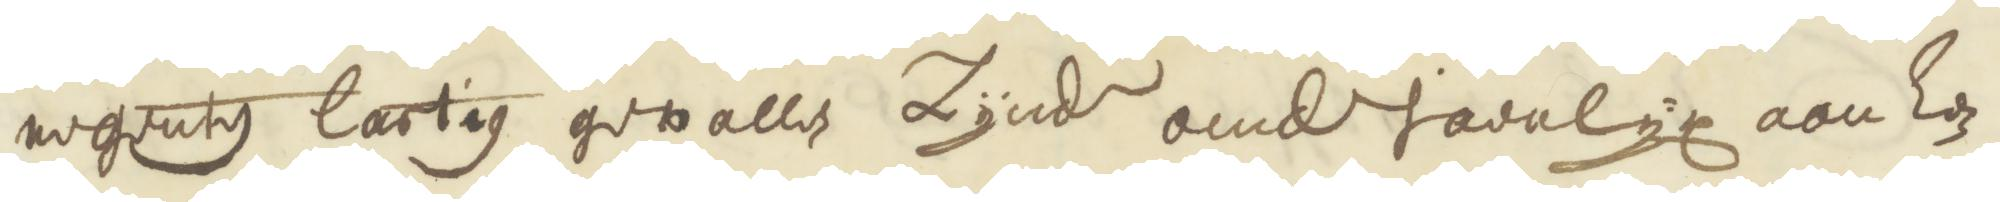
regenten lastig gevallen zijnde om de jaerlijx aan hen
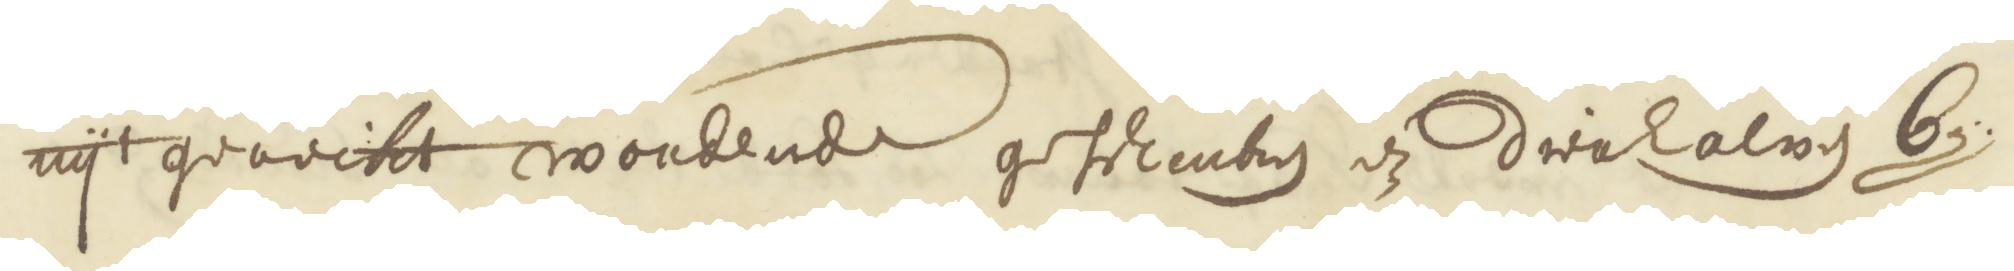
uijt gereikt wordende geschenken en dierhalven bij
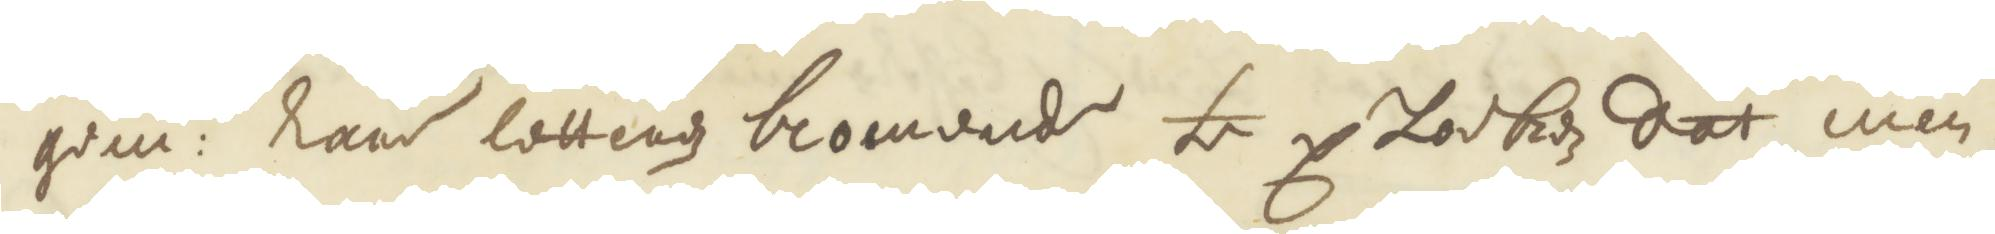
gem:te hare letteren komende te verzoeken dat men
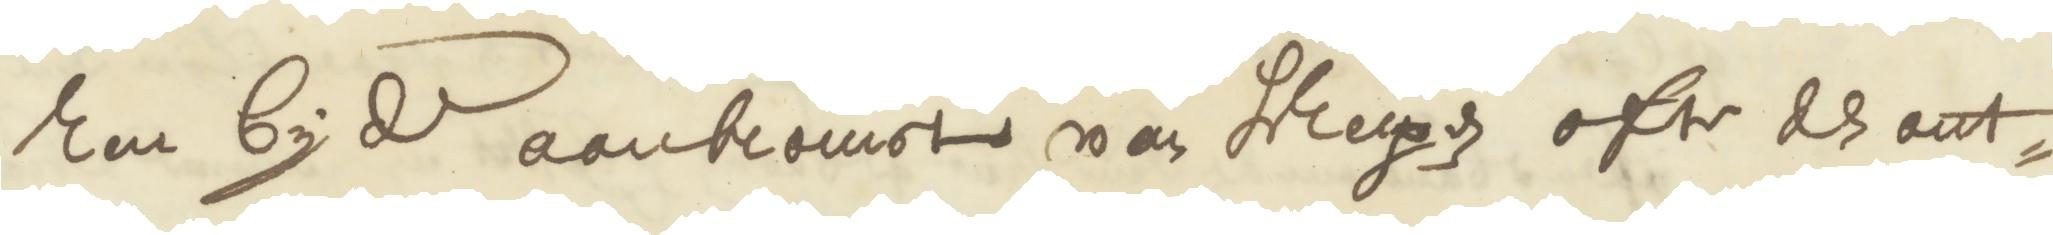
hen bij de aankomst van scheepen ofte den ont„
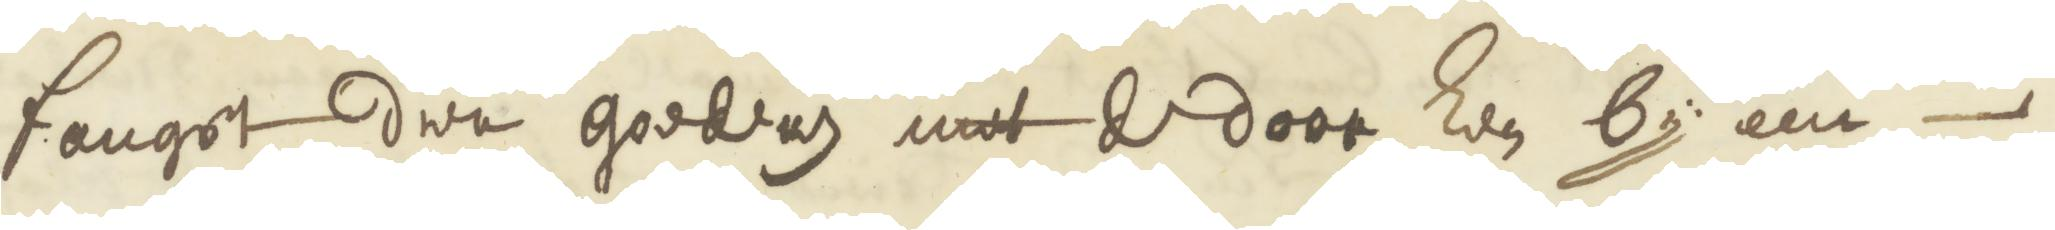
fangst dier goederen met de door hen bij een —
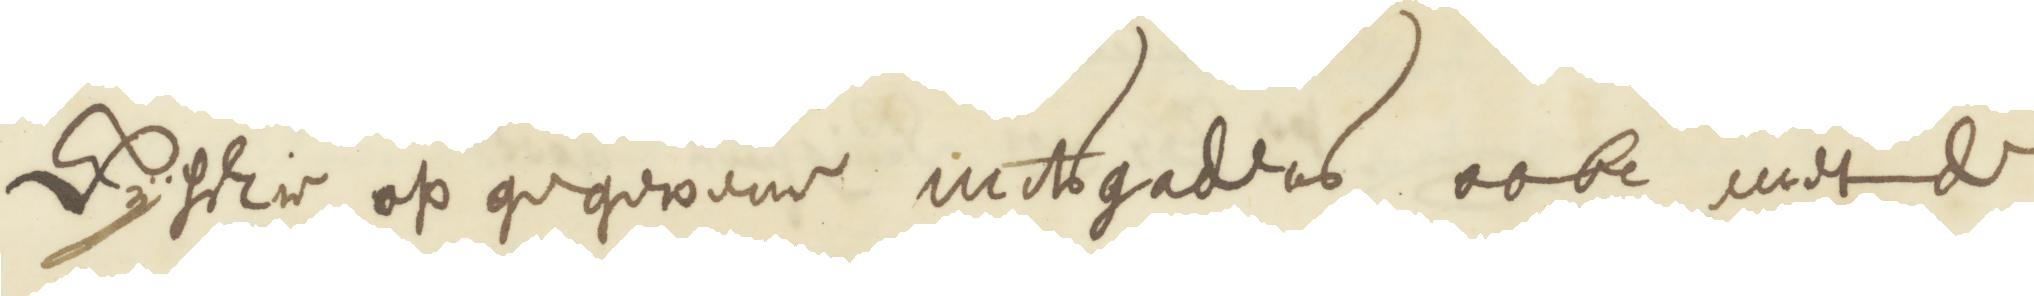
Eijschie op gegevene mitsgaders ook met de
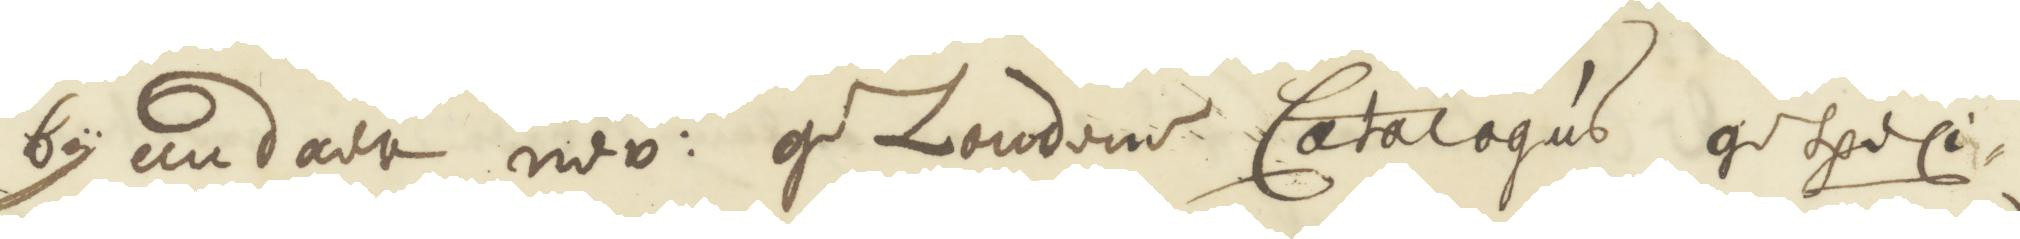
bij een daer nev:s op zondere Catalogus gespeci„
